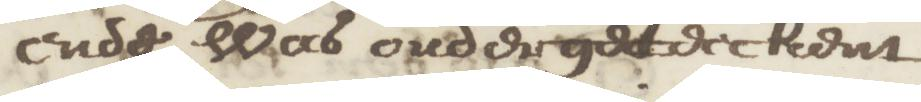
ende was ondergeteeckent
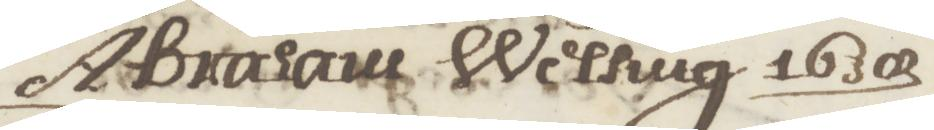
Abraham Welsing 1638
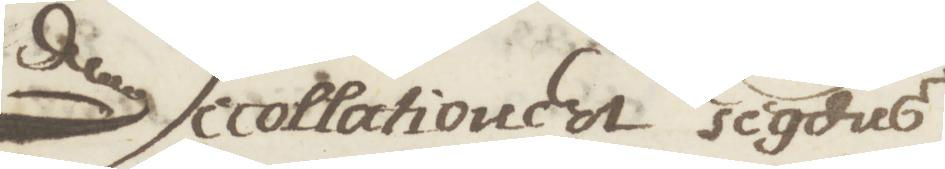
Gecollationert Tegens
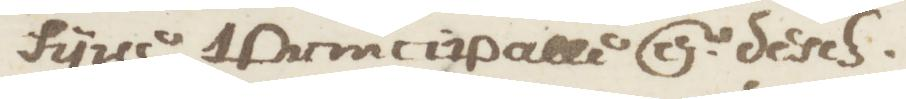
sijne principalle ende desen.
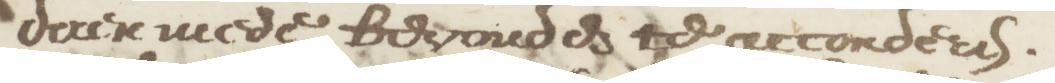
daer mede bevonden te accorderen.
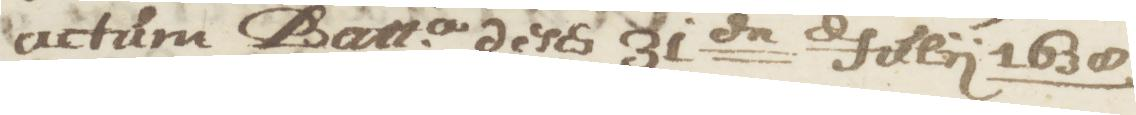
actum Batt.a desen 31=en Iulij 1638
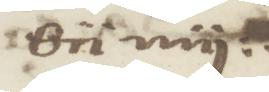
bii mij:
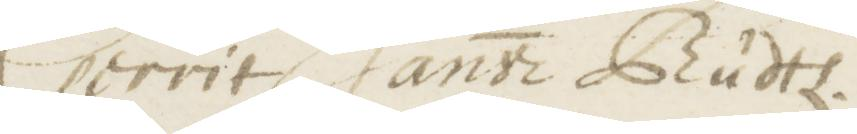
Gerrit Jansz. Rudtz.
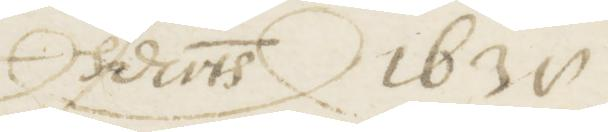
GIruts 1638
